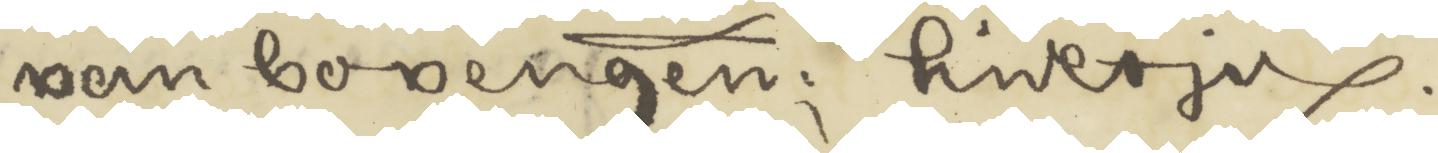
van bovengen: kieltje.
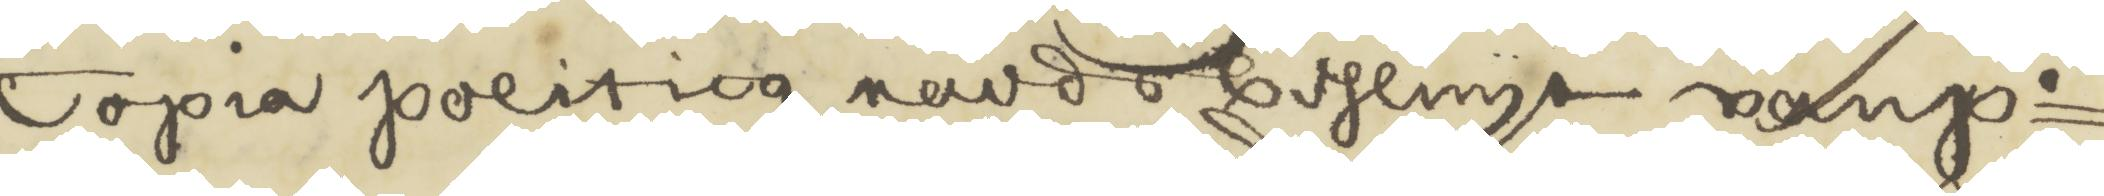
9. Copia politicq raeds besluijt van p=o
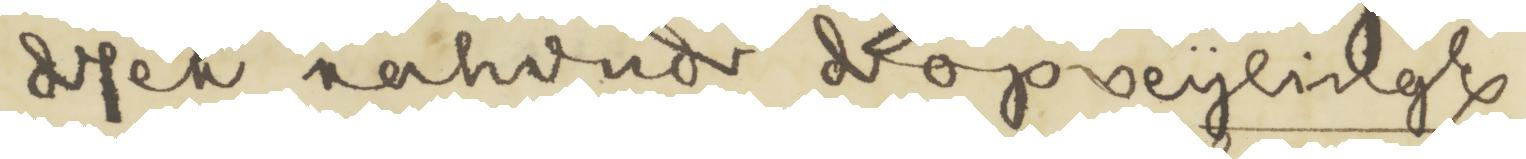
deser rakende de opveijlingh
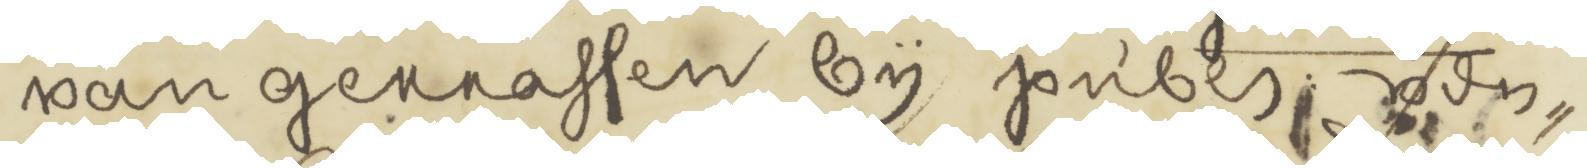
van gerrassen bij publijk ven„
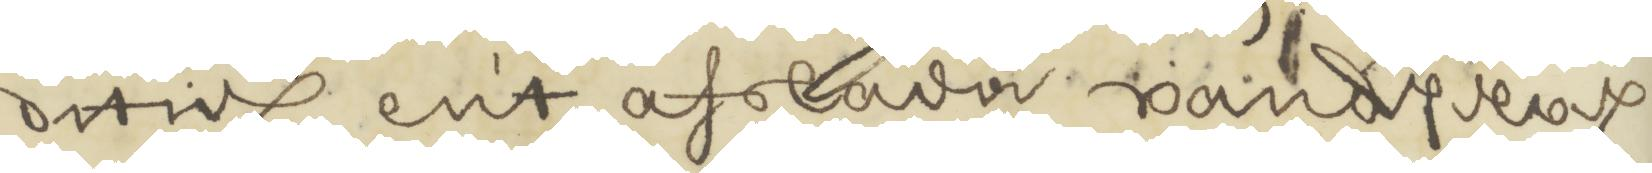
ditie en't afslaen van deselve
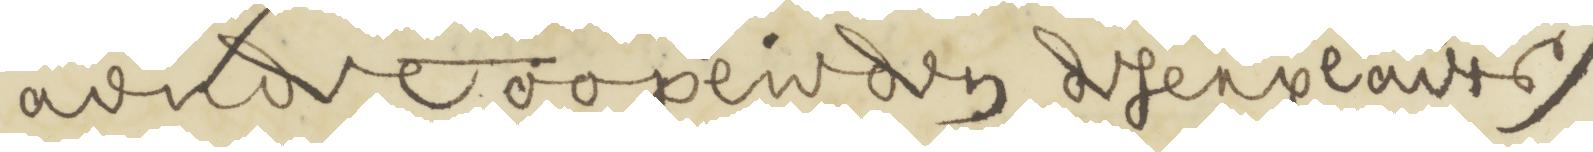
aen de Cooplieden deser plaets
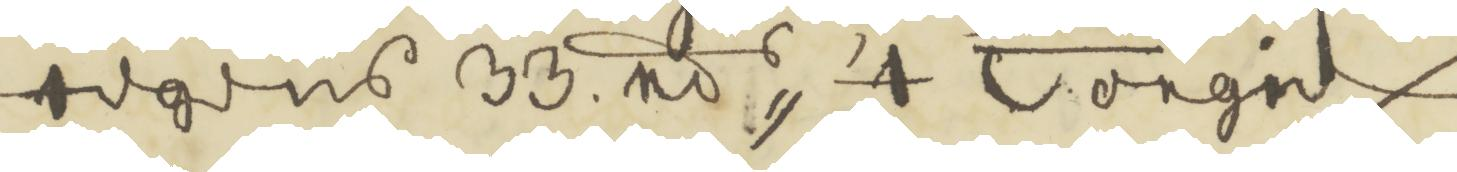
tegens 33. rd„s ’t Corgie
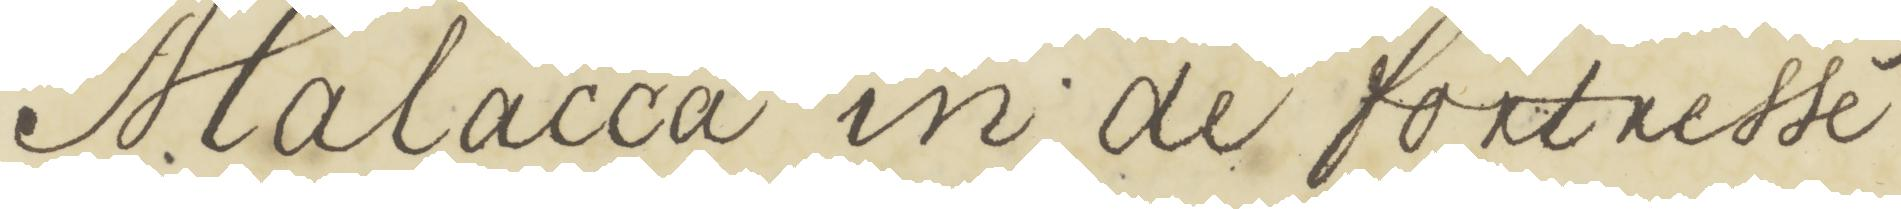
Malacca in de fortresse
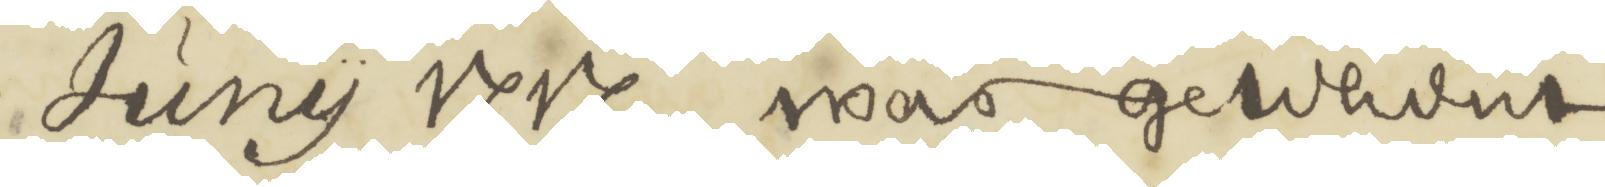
Den 8=en Junij 1717. was getekent
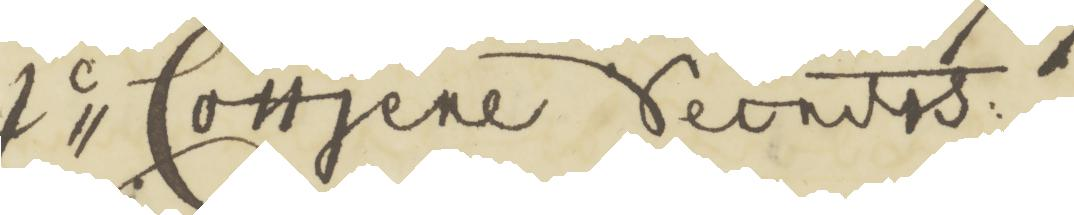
J„c Cottjere secrets:
